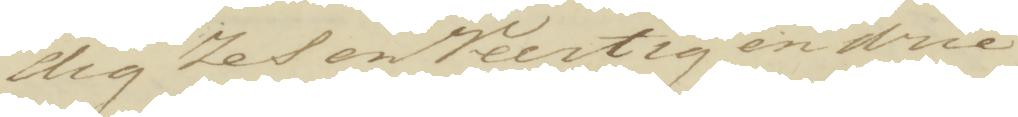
dig Zes en Veertig en drie
